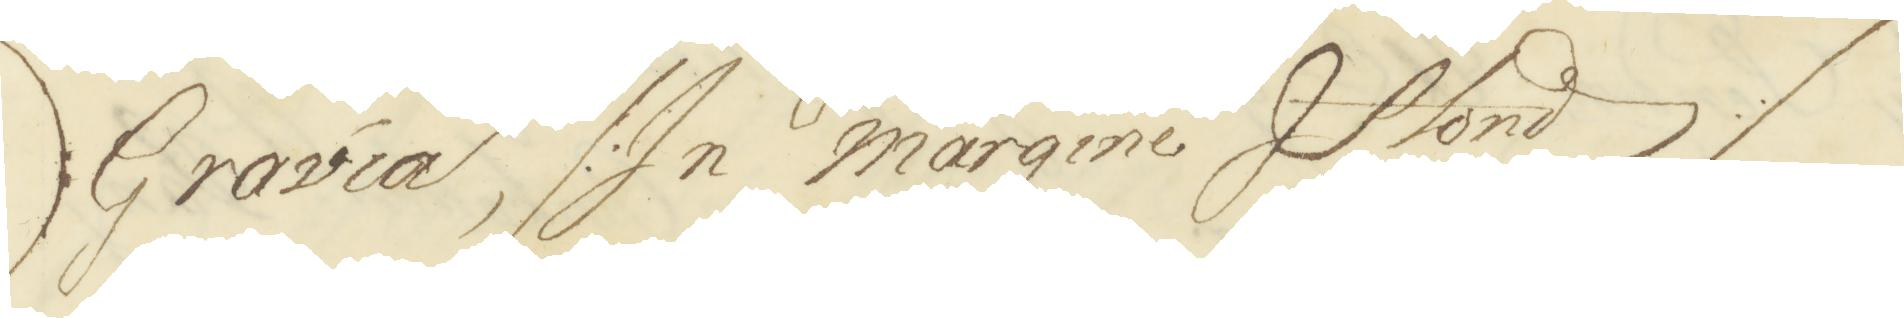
Gravia, /:Jn margine Stond:/
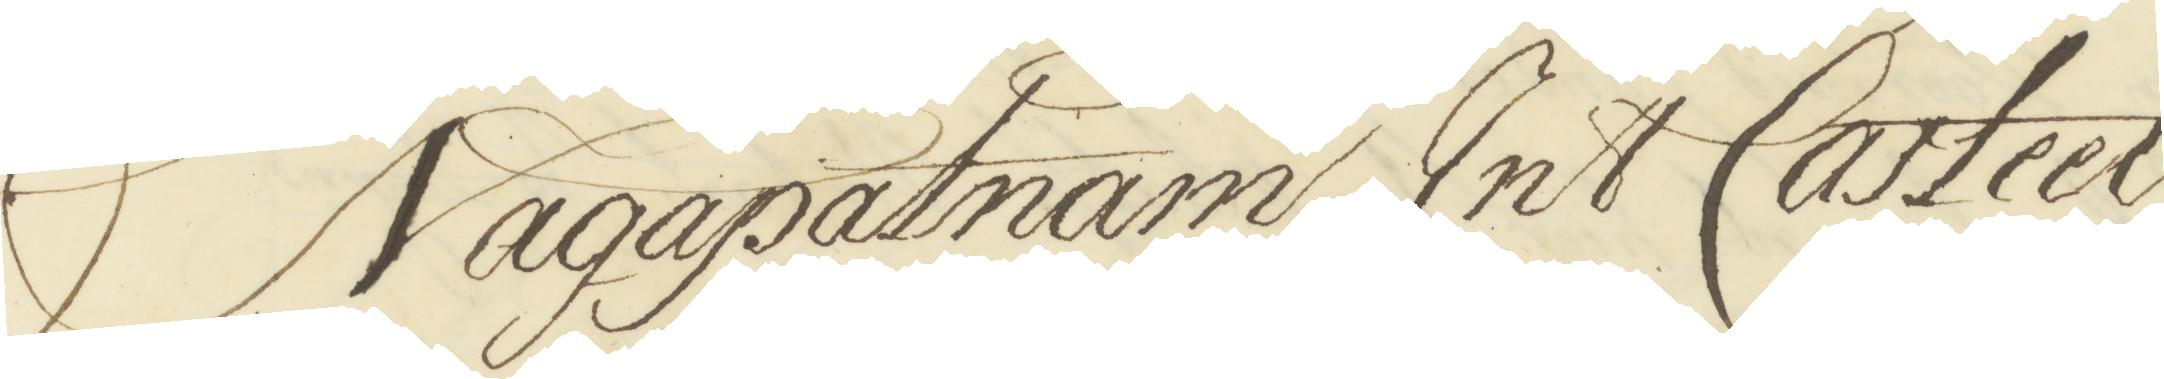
Nagapatnam Jn’t Casteel
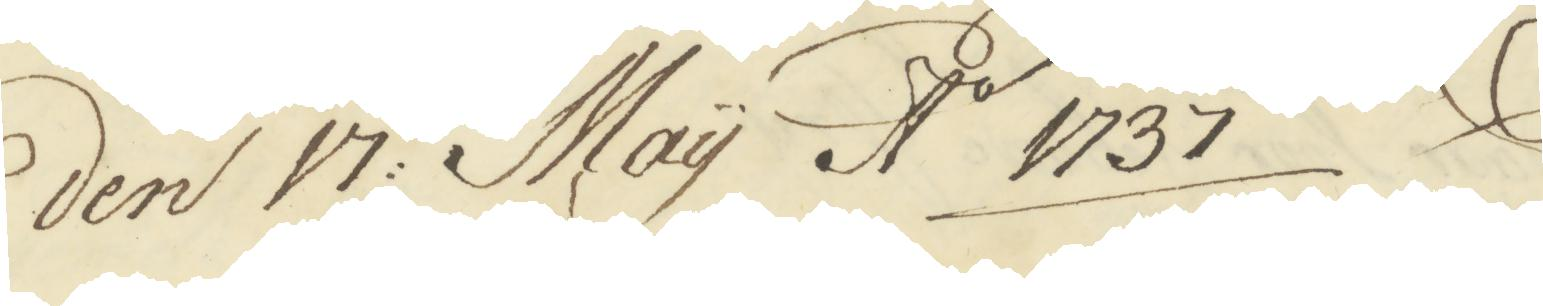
den 17:e Maij Ao 1737
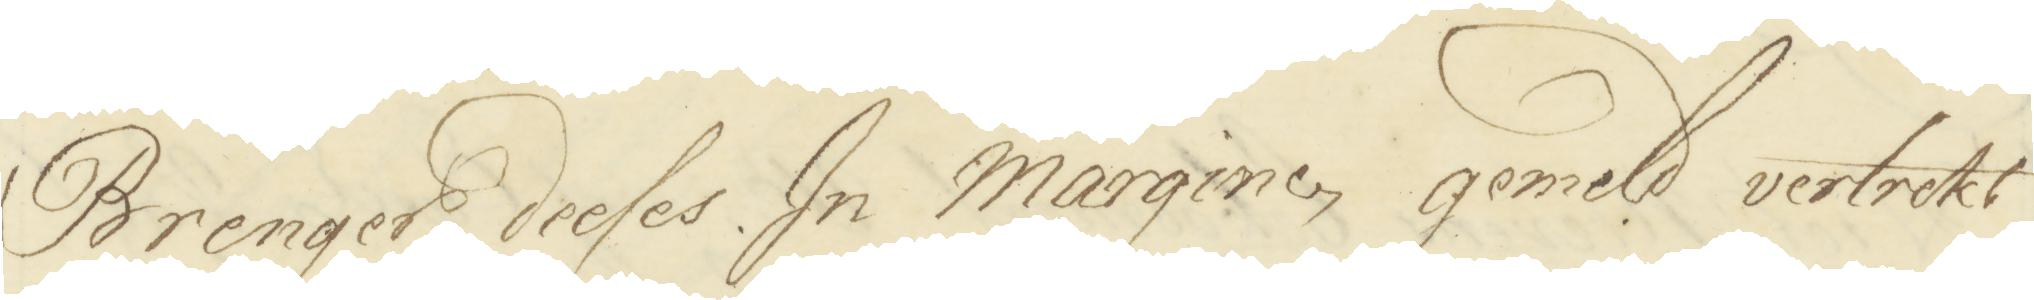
Brenger deeses. Jn marginen gemeld vertrekt
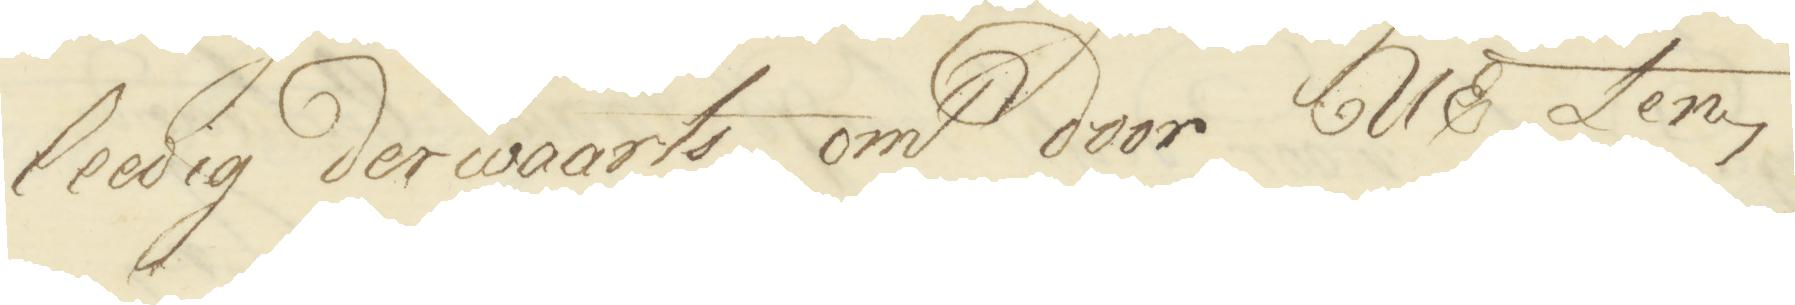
leedig derwaarts. om door UE ten
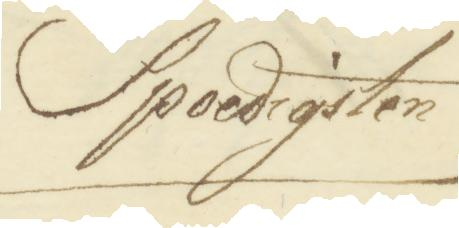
Spoedigsten
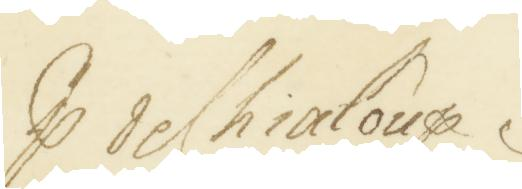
pr de Chialoup
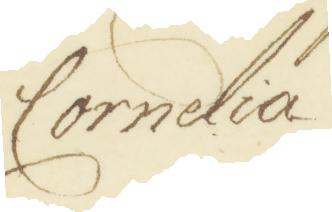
Cornelia
